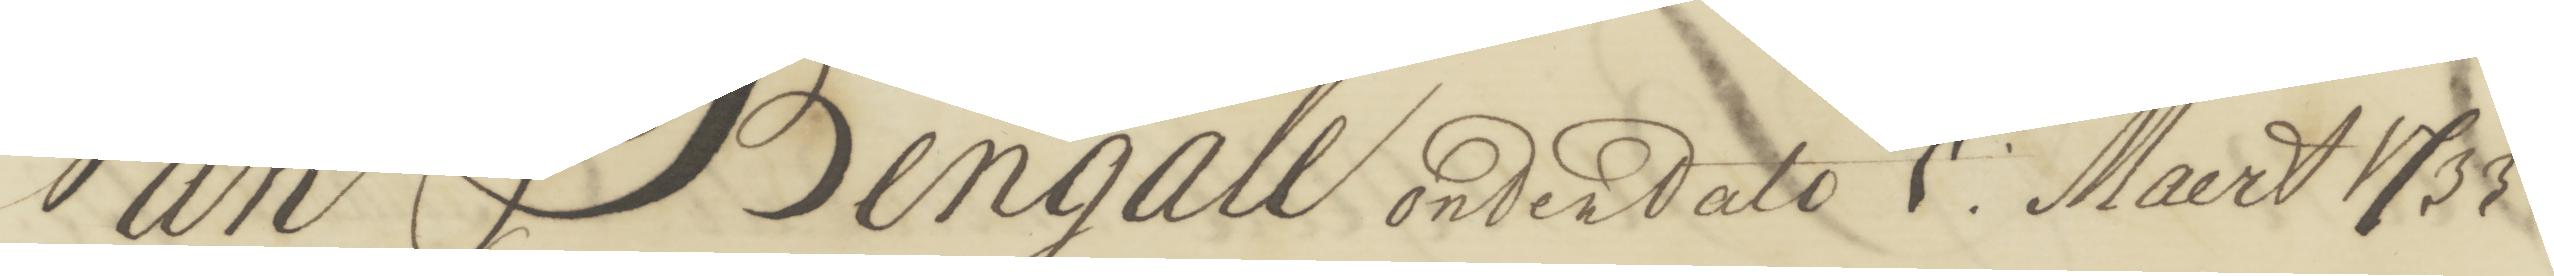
Van Bengall onder dato 5:' Maert 1733.
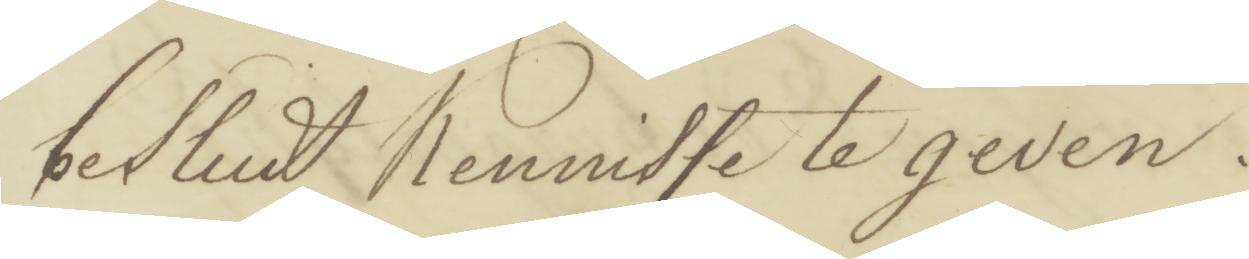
besluit Kennisse te geven
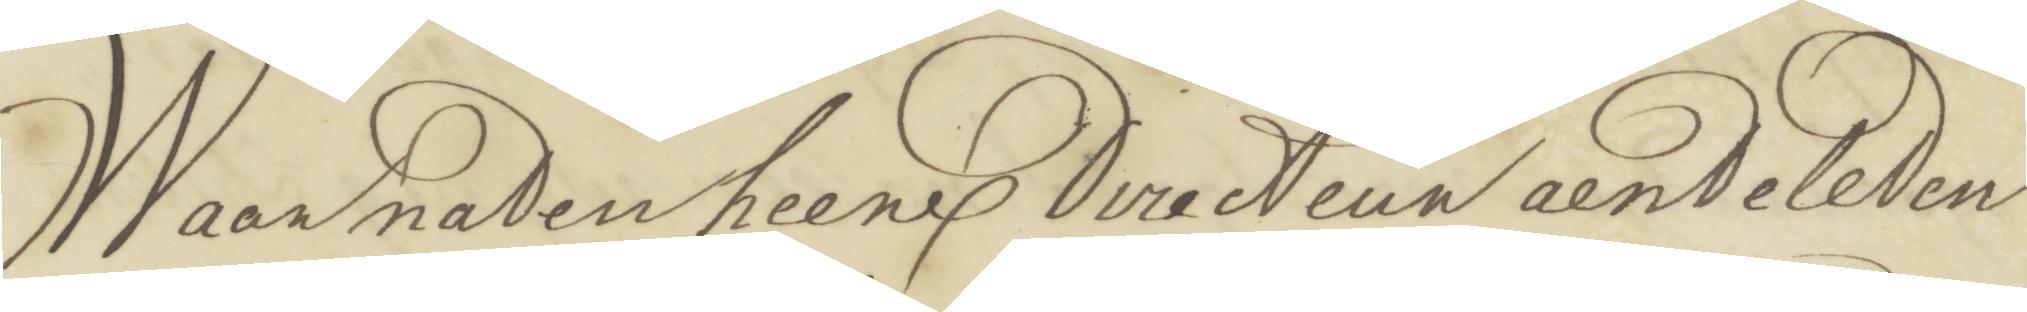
Waar na den heere directeur aen de leden
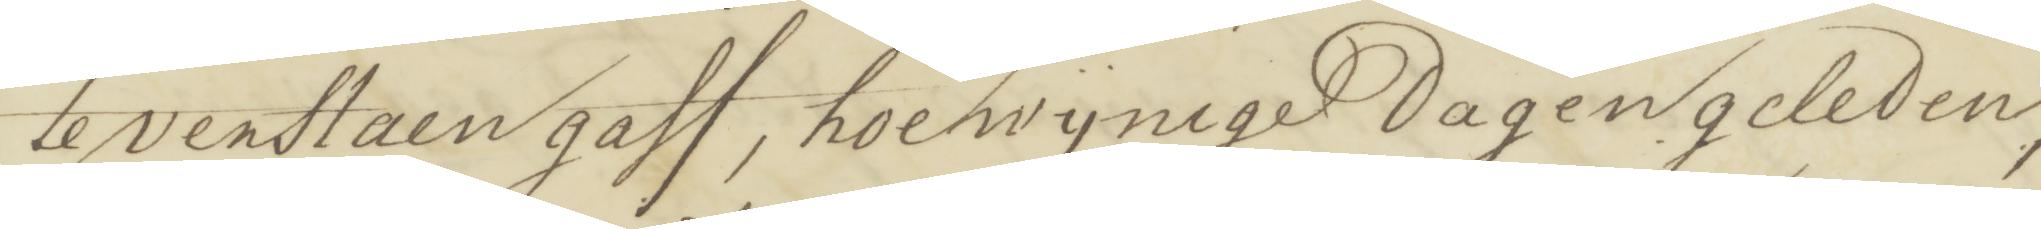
te verstaen gaff, hoe wijnige dagen geleden,
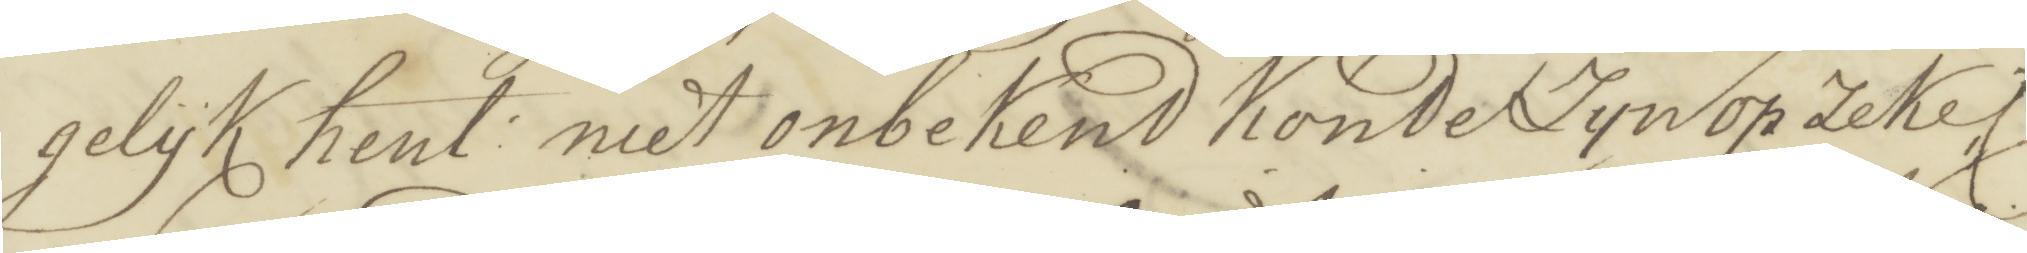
gelijk henl: niet onbekend konde Zyn op zeke
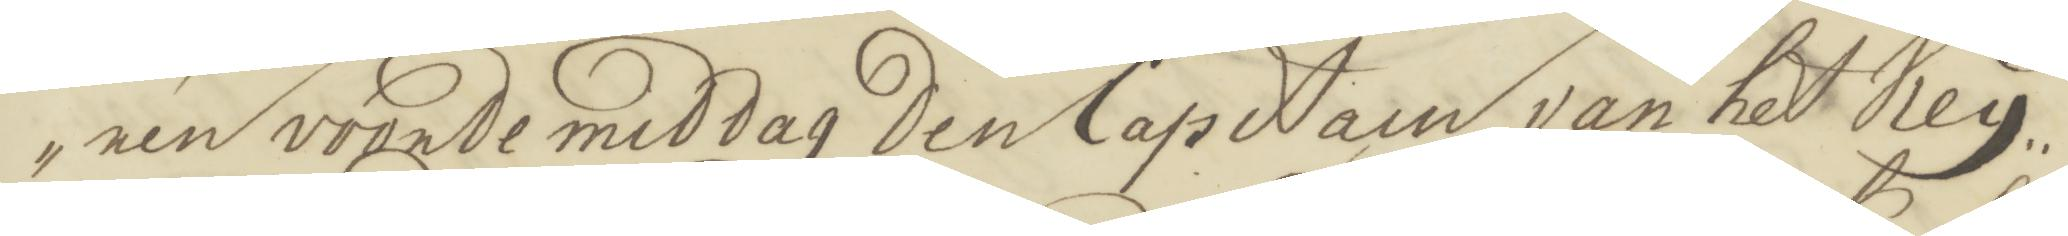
„ren voor de middag den Capitain van het Keij„
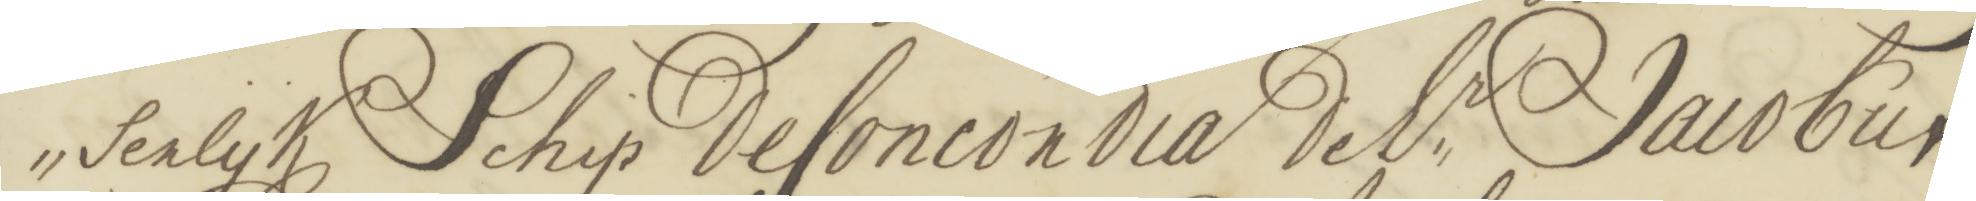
„serlijk Schip de Concordia de h:r Iacobus
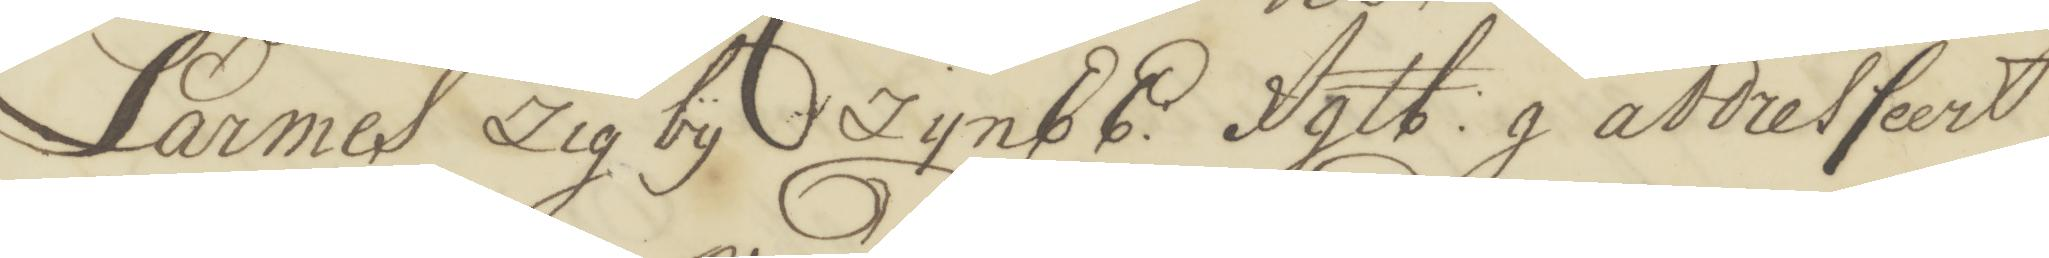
Larmes zig bij Zijn E E: Agtb: g’addresseert,
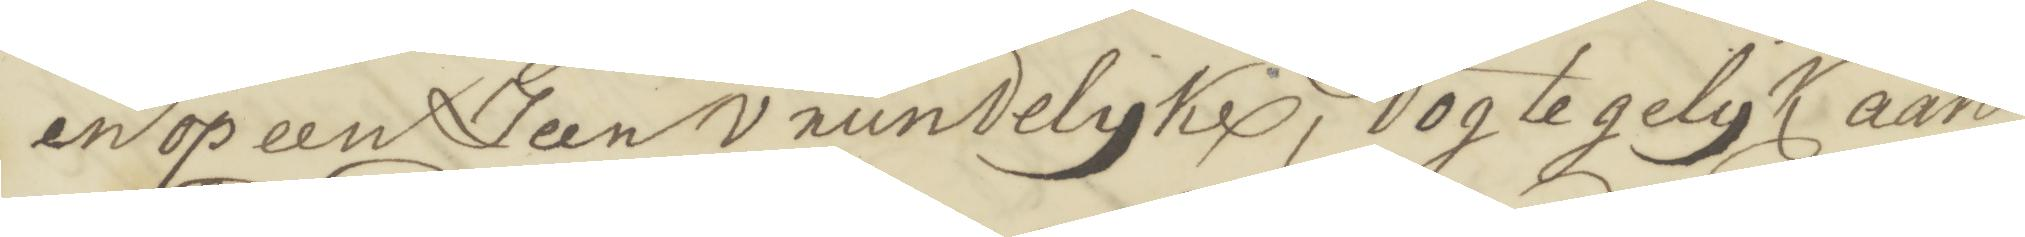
en op een zeer vrundelijke, dog te gelijk aan
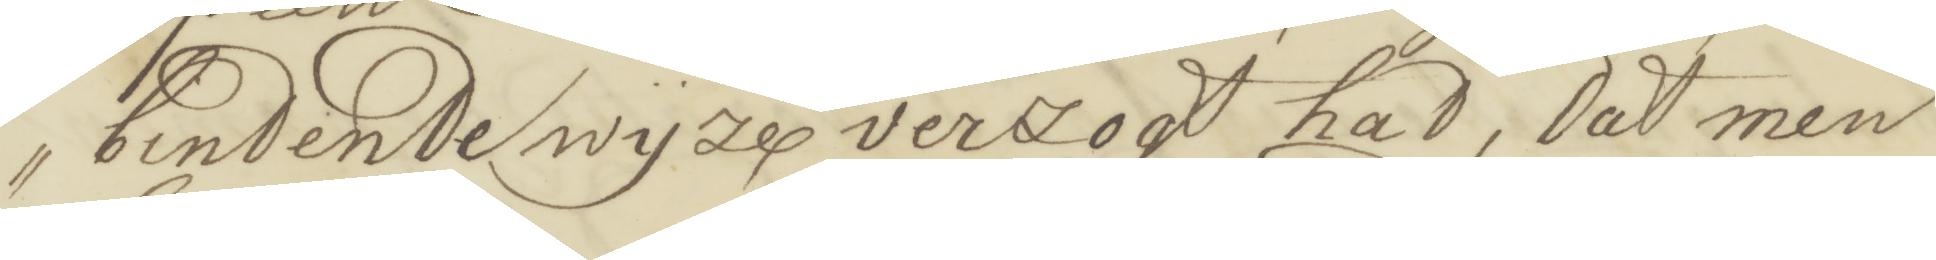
„bindende wijze verzogt had, dat men
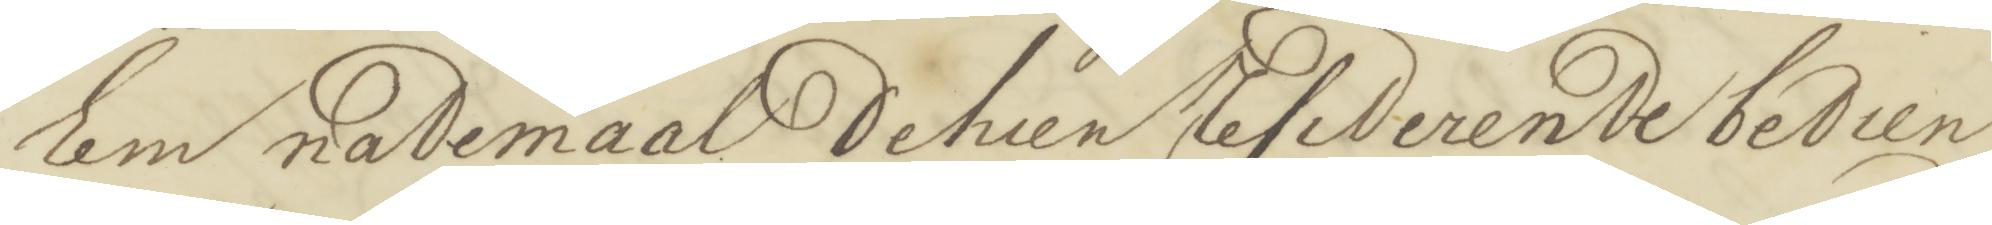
hem nademaal de hier residerende bedien
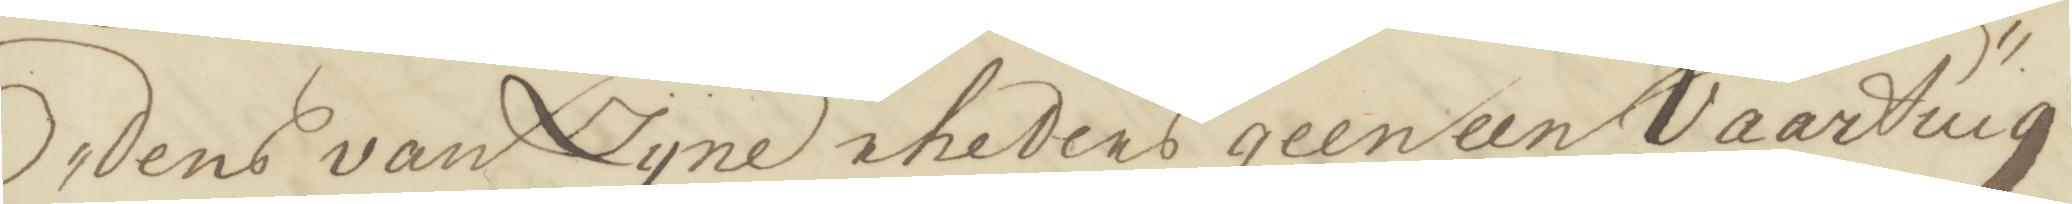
„dens van zijne rheders geen een vaartuig
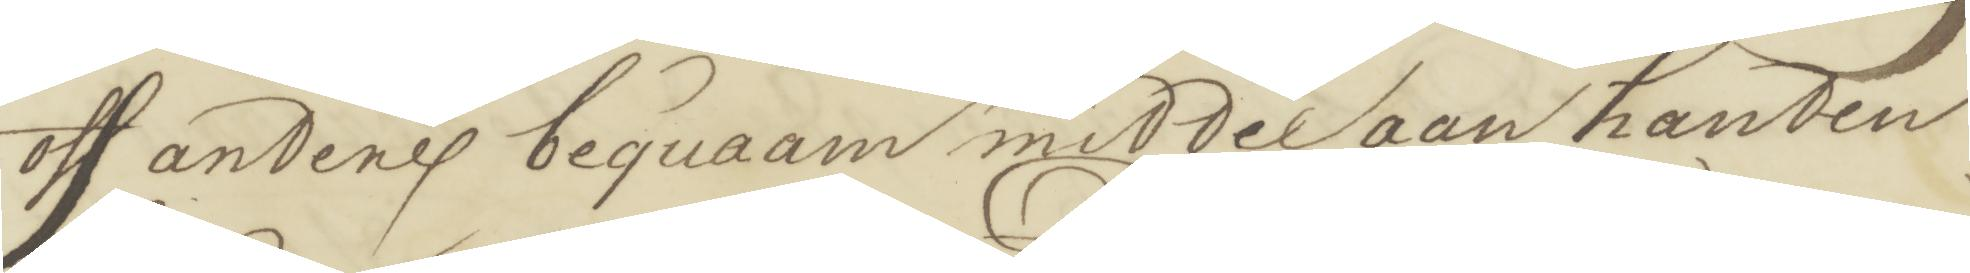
off ander bequaam middel aan handen
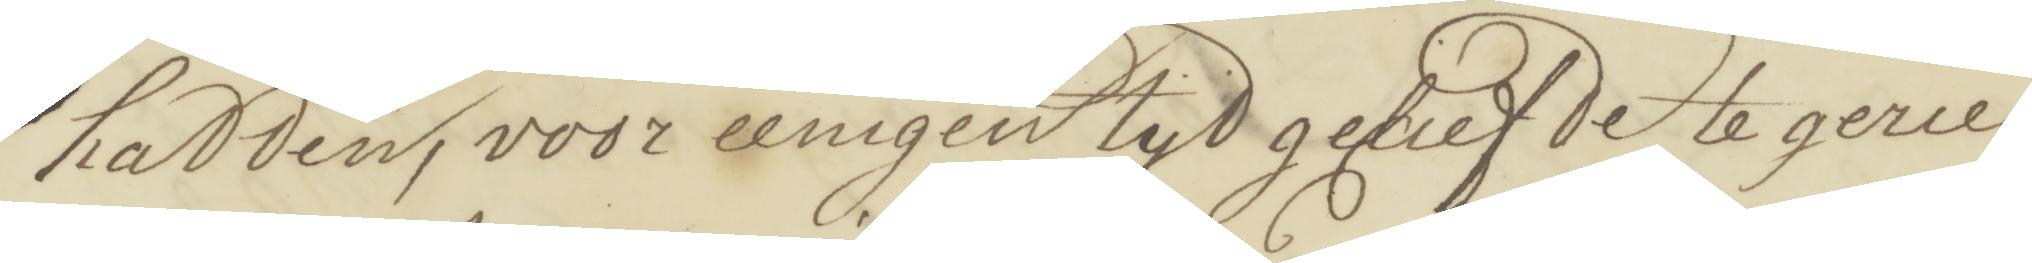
hadden, voor eenigen tijd geliefde te gerie
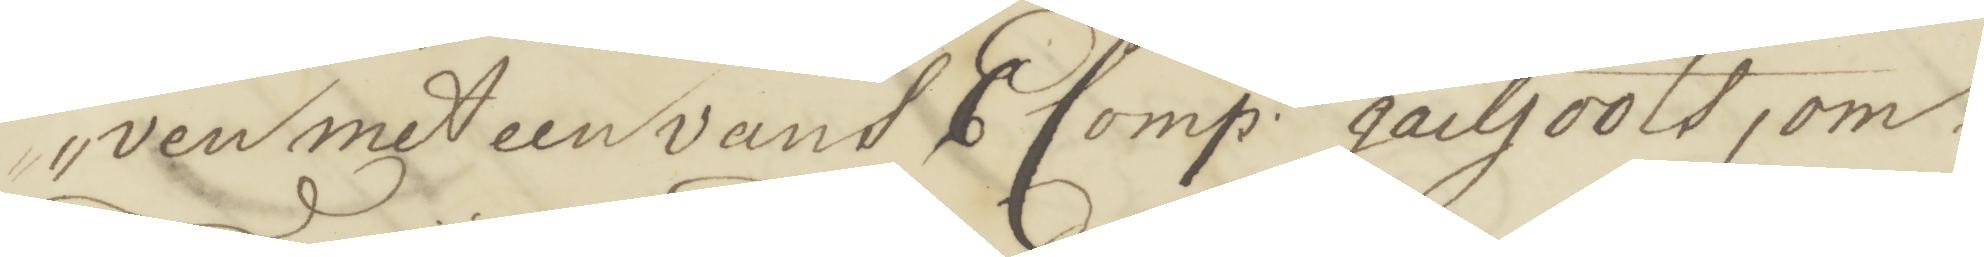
„ven met een van 'S E Comp:e gailjoots, om
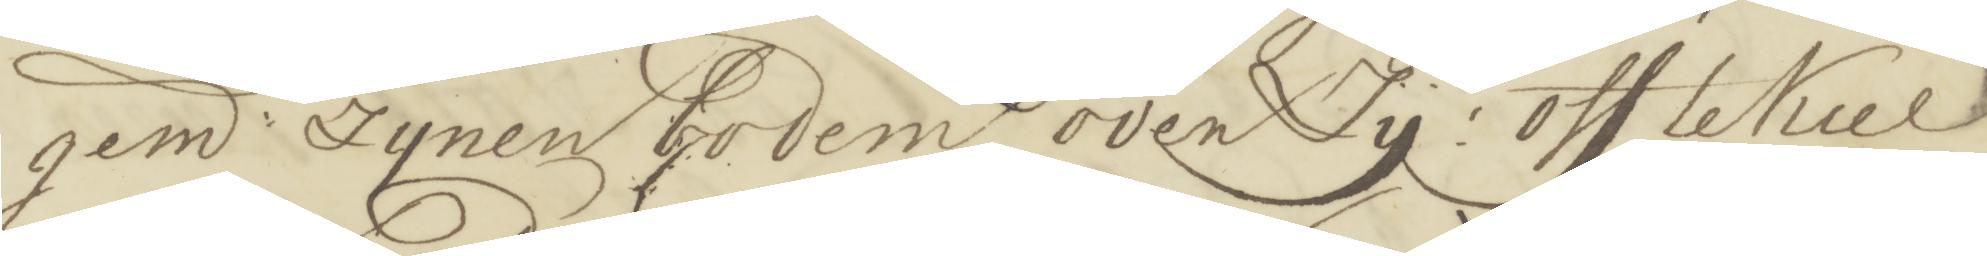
gem:e zijnen bodem over Zij: off te Kiel
